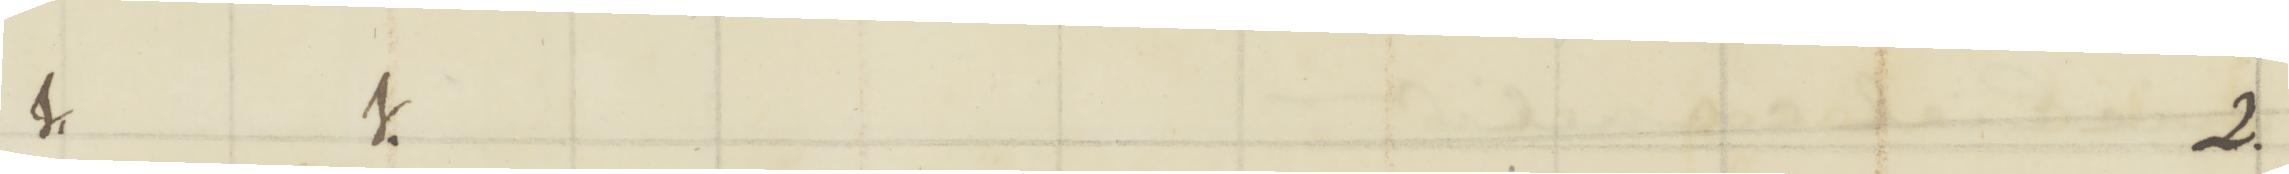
1. 1. 2.
